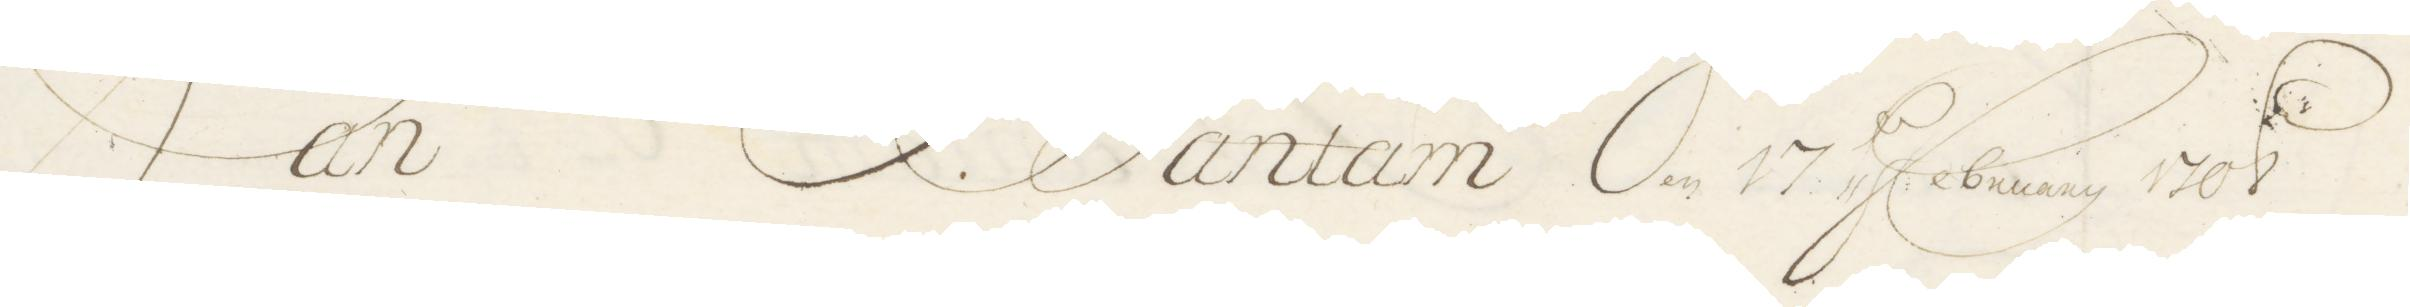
Van Bantam Den 17„en February 1708
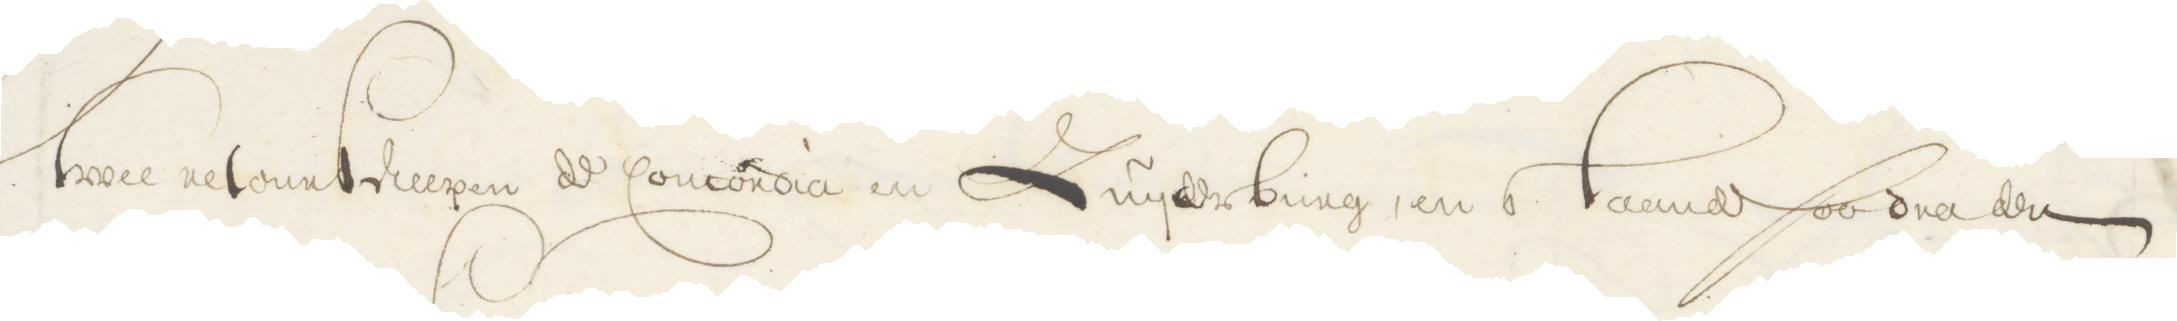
twee retourscheepen de Concordia en Zuijderburg, en staande soo dra den
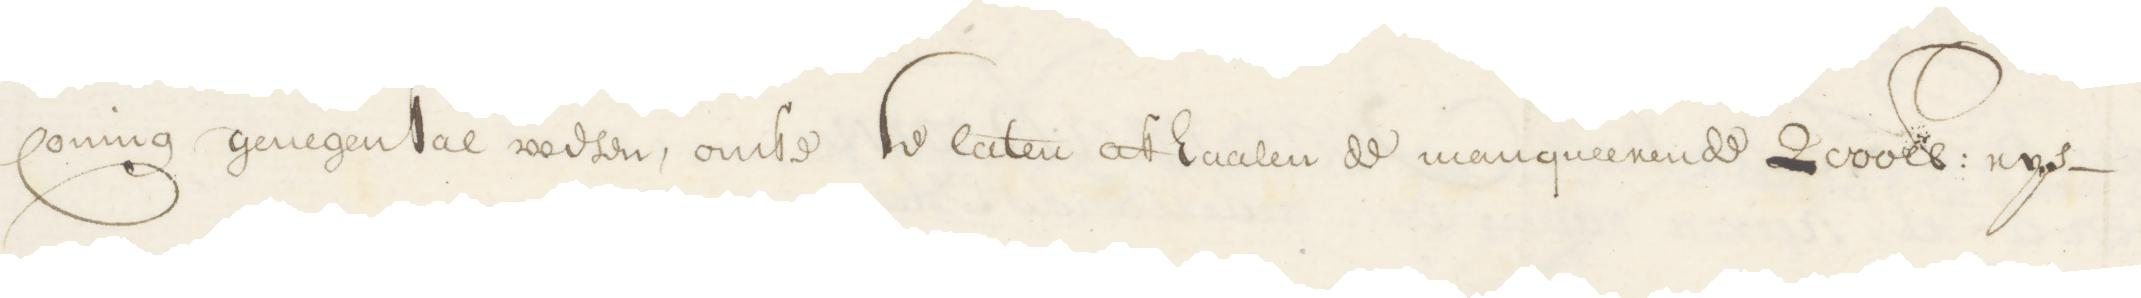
Coning genegen sal wesen, omse te laten afhaalen de manqueerende 2 voors: rys—
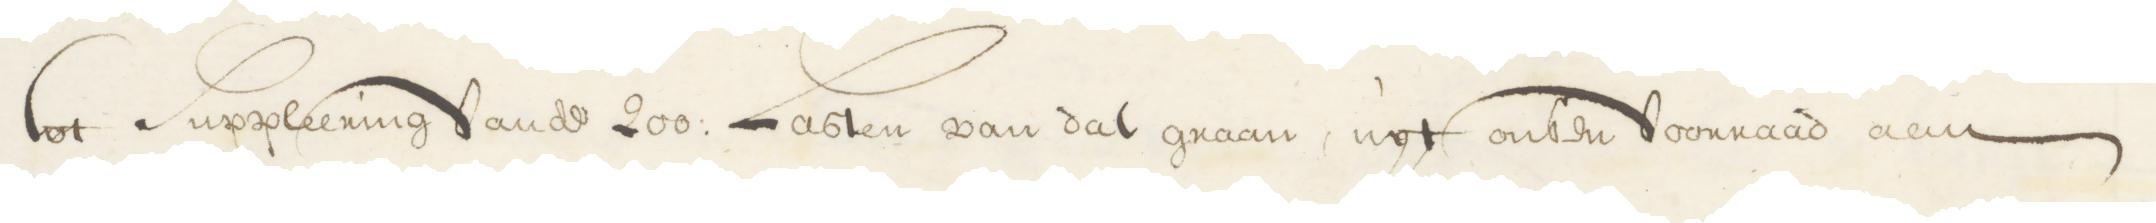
tot suppleering van de 200: lasten van dat graan, uijt onsen voorraad aan
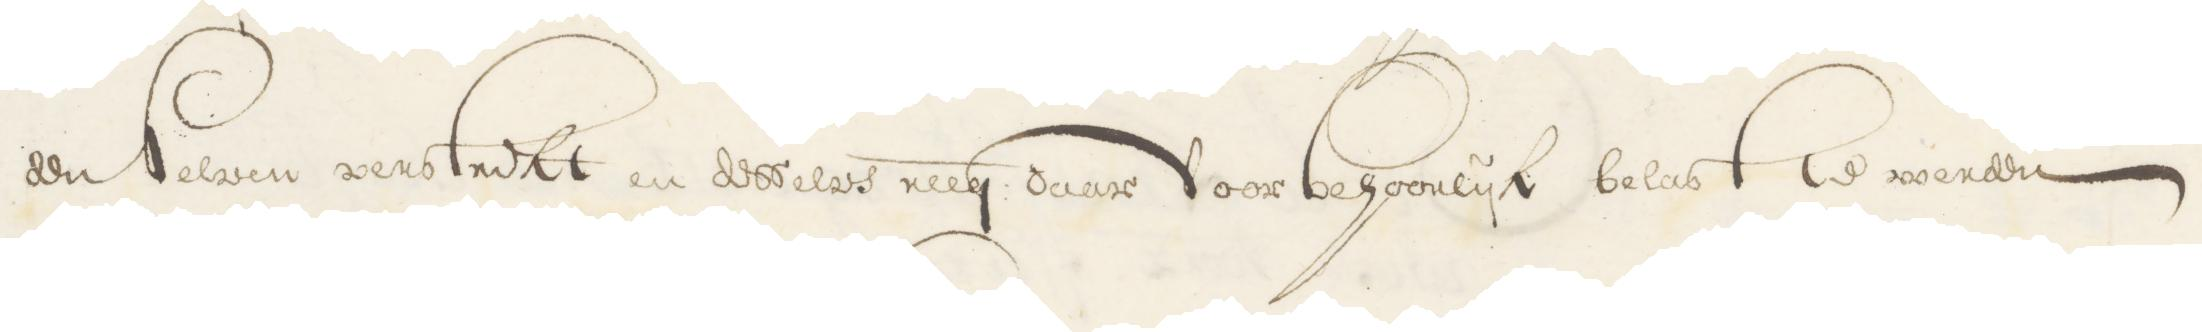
den selven verstrekt en desselvs reeq: daar voor behoorlijk belast te werden
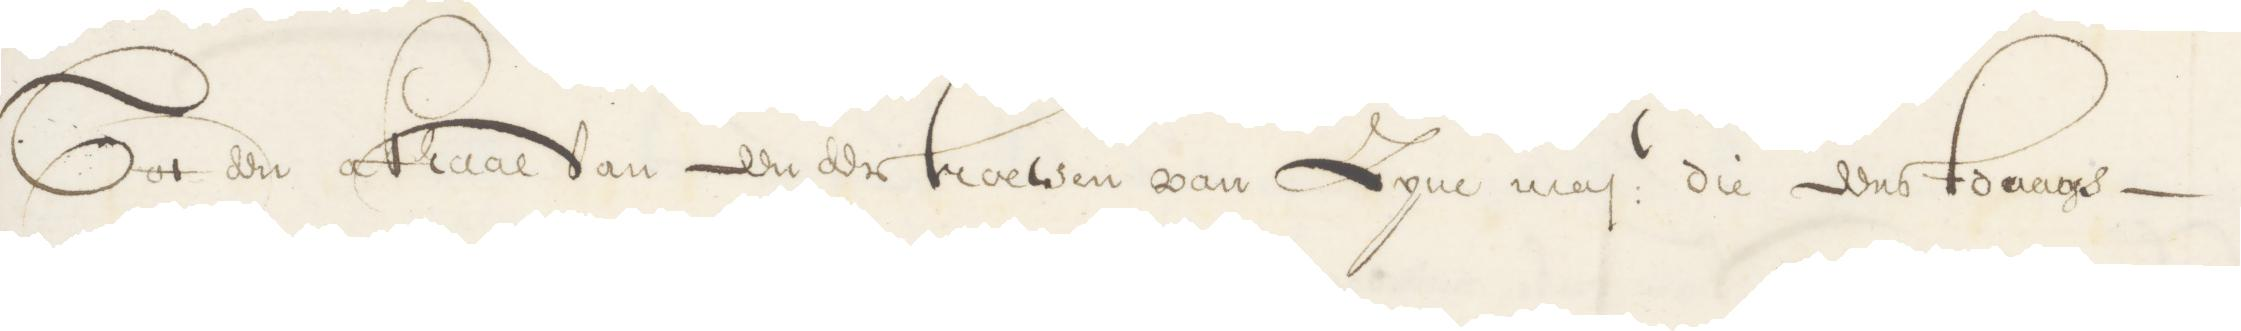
Tot den afhaal van een der koetsen van Zijne maj:t die eerstdaags —
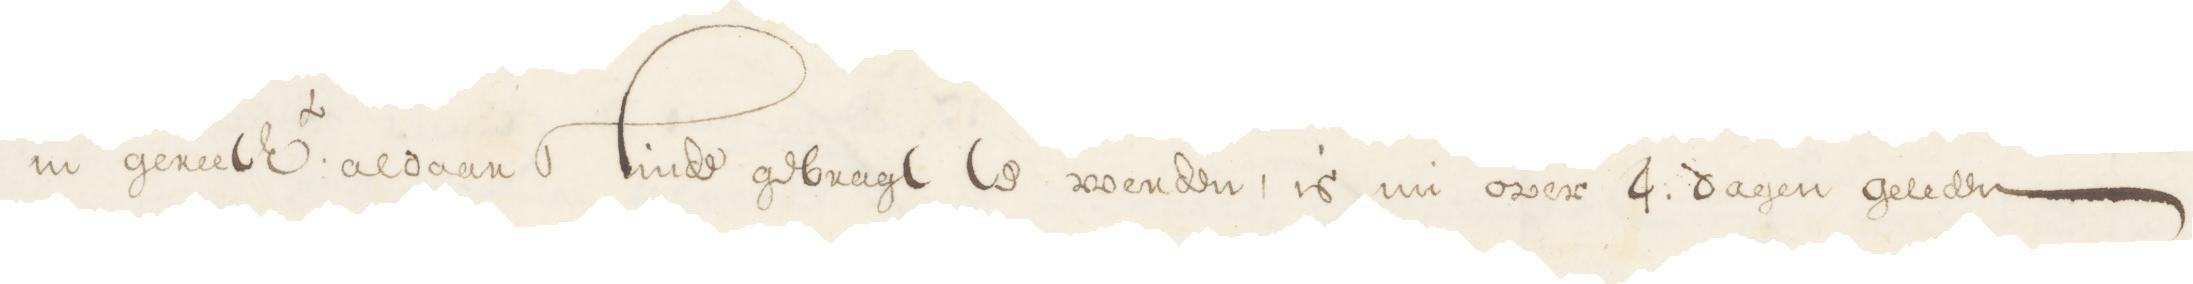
in gereeth:t aldaar stinde gebragt te werden, is nu over 4. dagen geleden
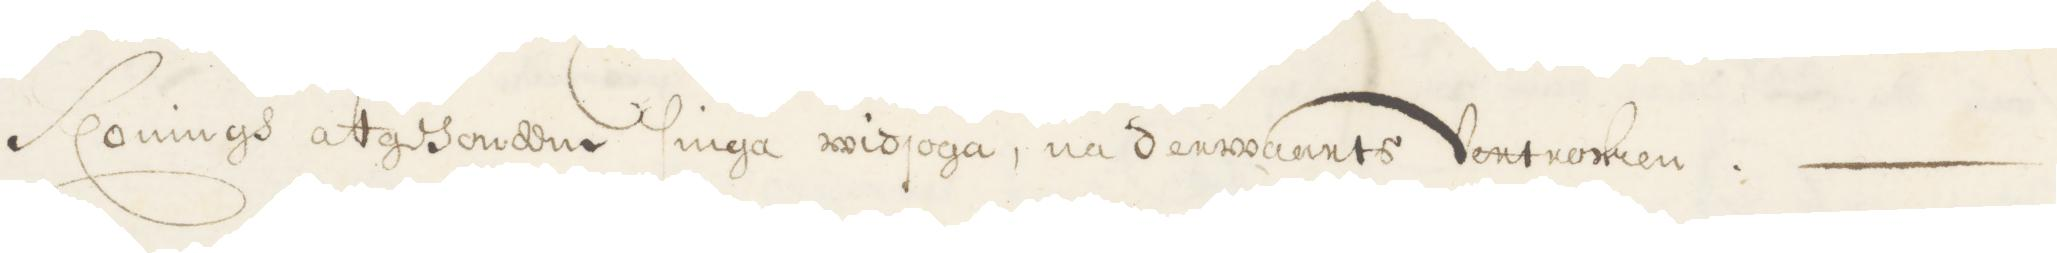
Konings afgesonden singa widjoga, na derwaarts vertrocken. —
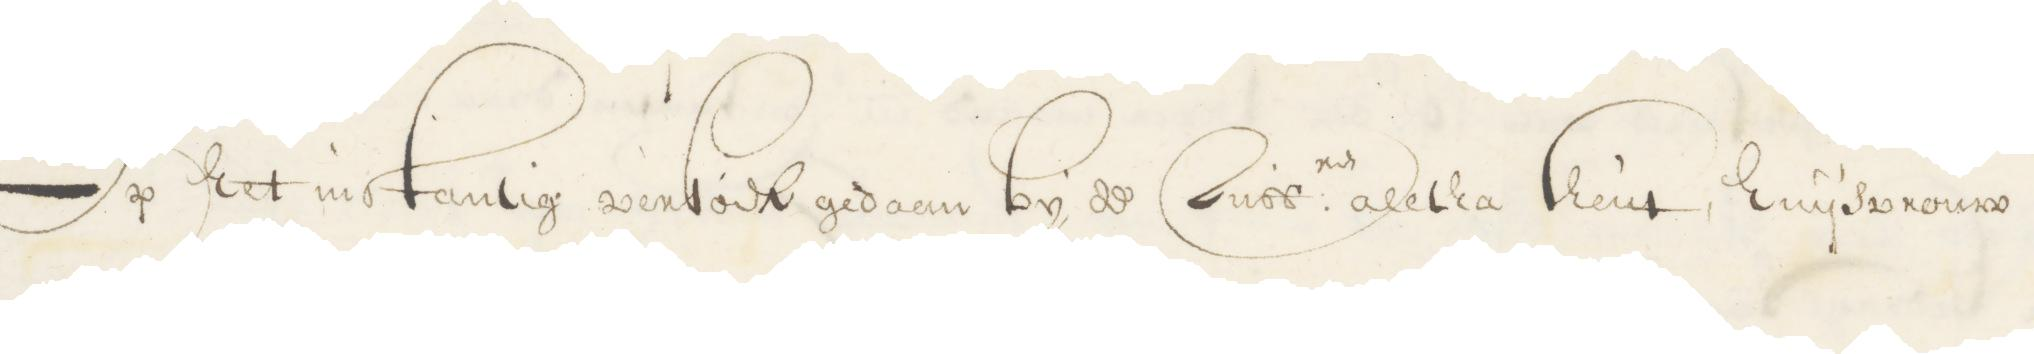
Op het instantig versoek gedaan bij de Inw:ren aletha theut, huijsvrouw
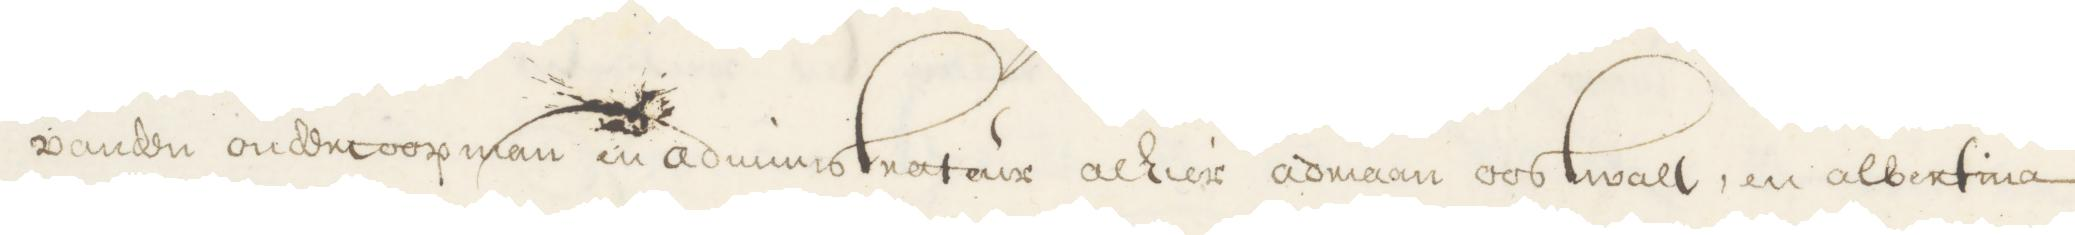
vanden ondercoopman en administrateur alhier adriaan oostwalt, en albertina
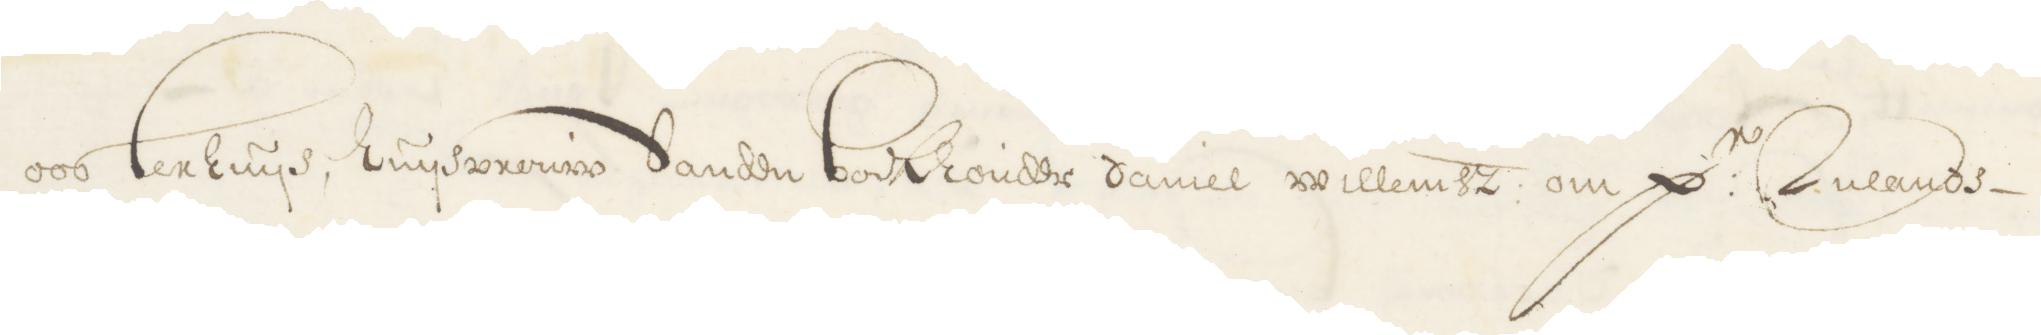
oosterhuijs, huijsvrouw van den boekhouder daniel willemsz: om p:r Inlands-
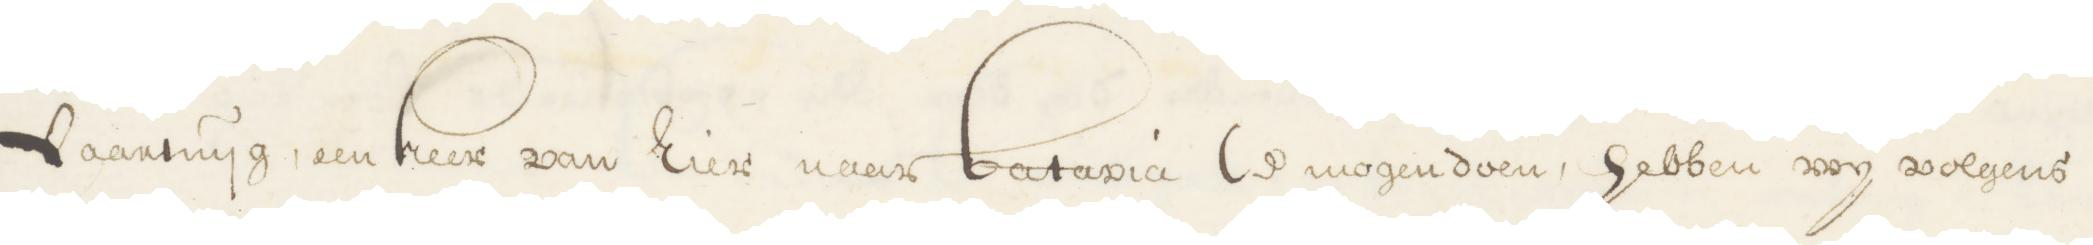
Vaartuijg, een keer van hier naar Batavia te mogen doen, hebben wij volgens
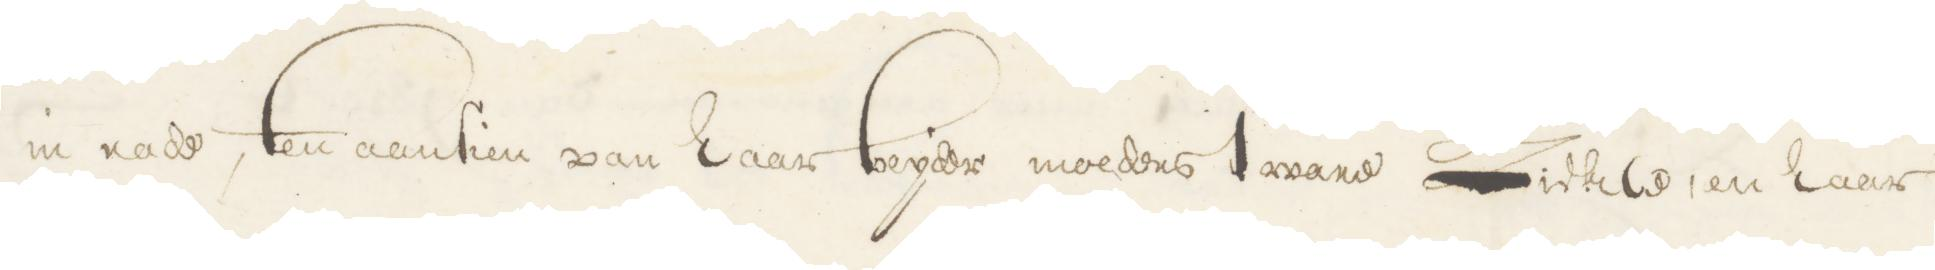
in rade, ten aansien van haar beijder moeders sware Ziekte, en haar
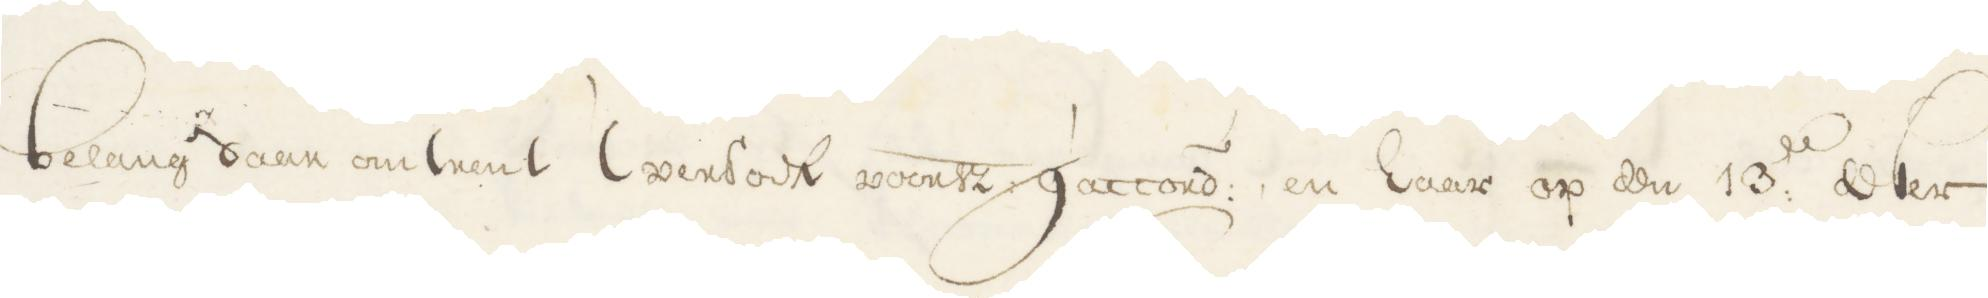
belang daar omtrent ’tversoek voorsz: g’accord:, en haar op den 13:e deser
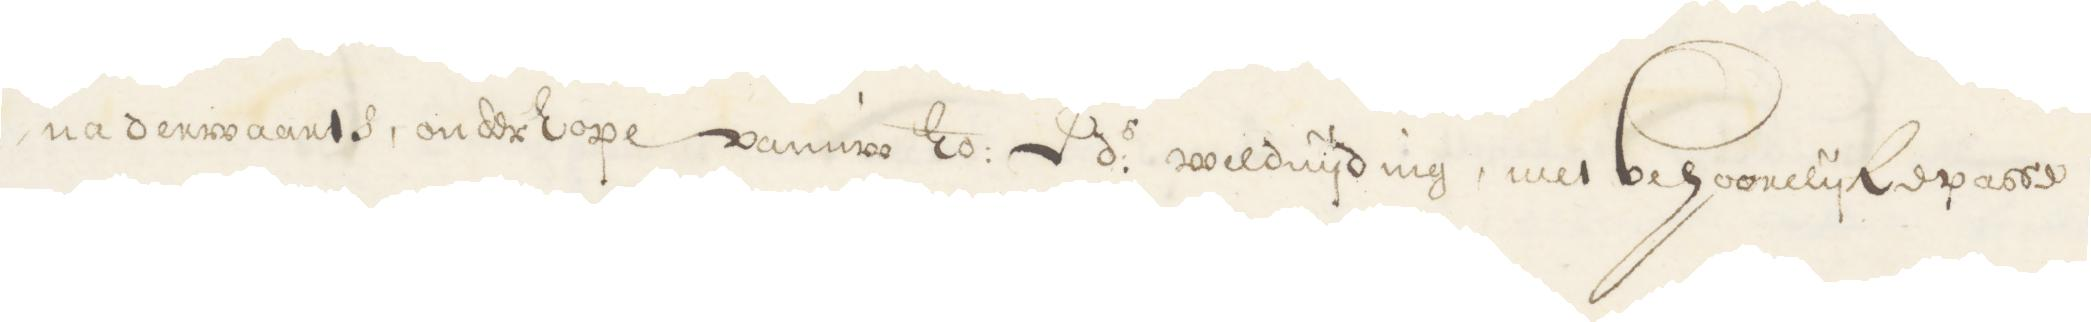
na derwaarts, onderhope vanuw ho: Ed:s welduijding, met behoorelijkepasse
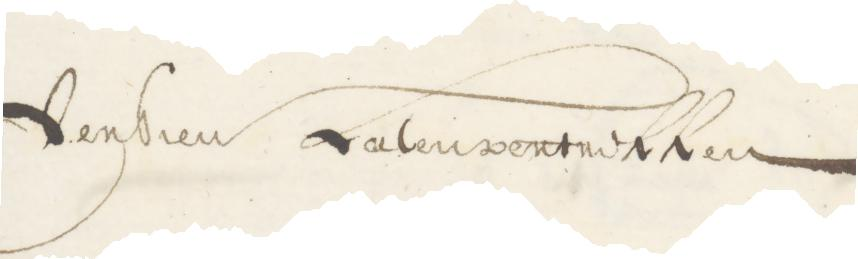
Versien latenvertrekken
